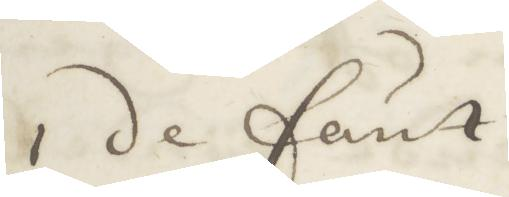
, de faut
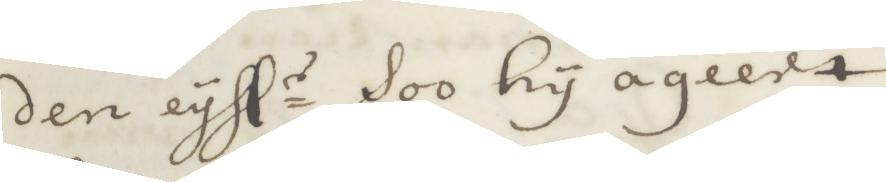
den eijss=r soo hij ageert
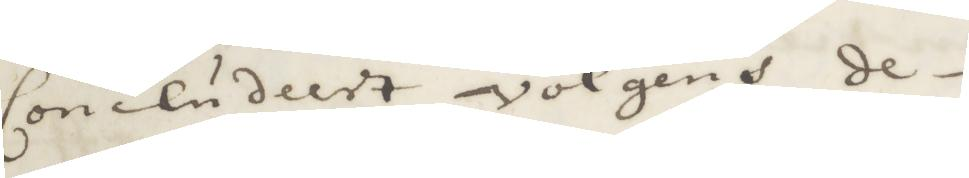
Concludeert volgens de —
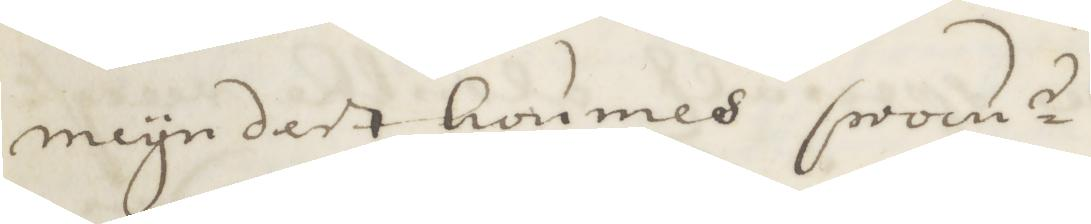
meijn dert houmes procu=r
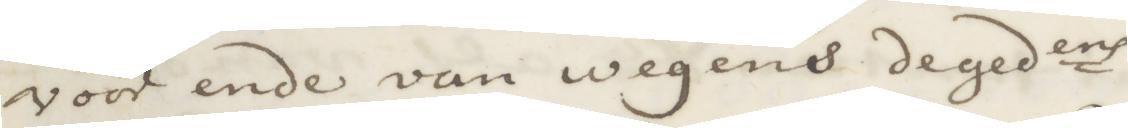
voor ende van wegens de ged=ens
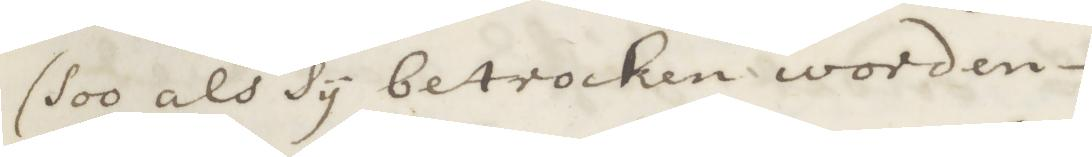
(soo als sij betrocken worden —
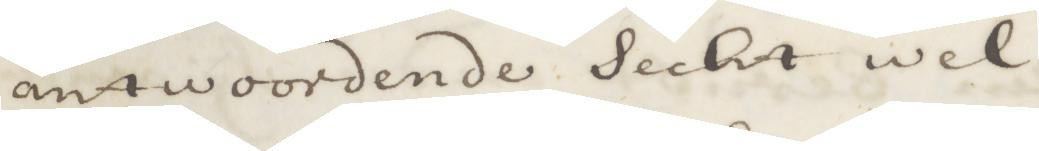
antwoordende secht wel
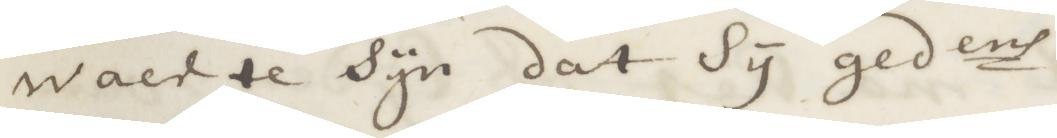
waer te sijn dat sij ged=ens
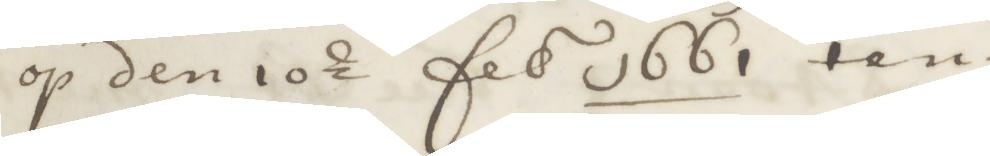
op den 10=e feb 1661 ten —
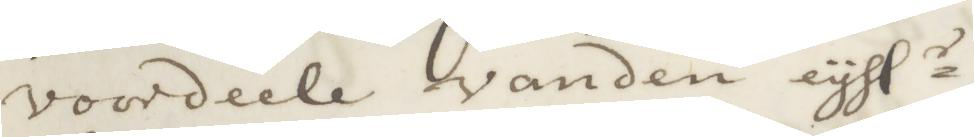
voordeele vanden eijss=r
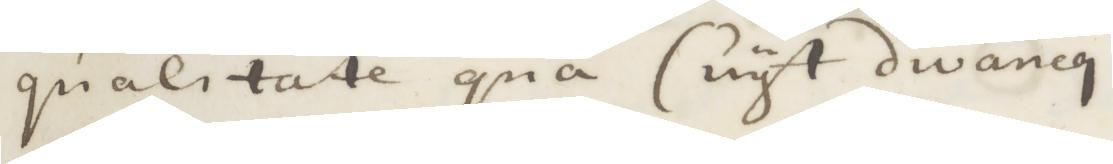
qualitate qua (uijt dwancq
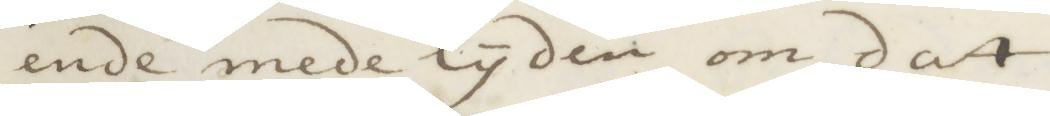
ende mede lijden om dat
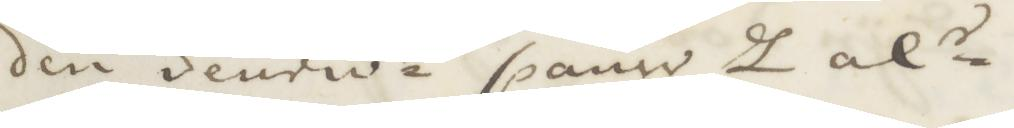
den deurw=r pauw Zal=r
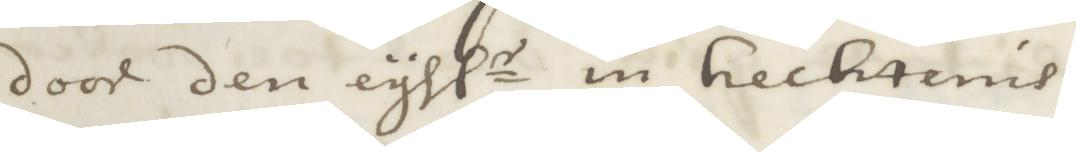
door den eijss=r in hechtenis
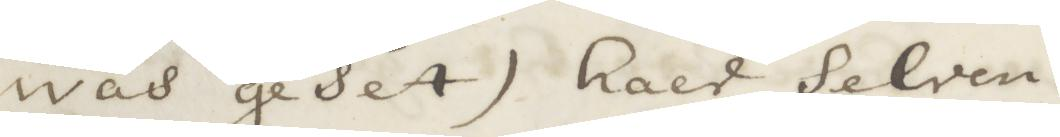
was geset) haer selven
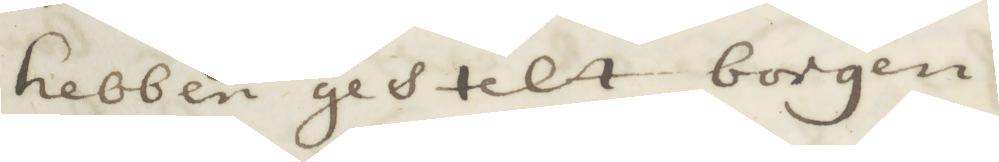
hebben gestelt borgen
